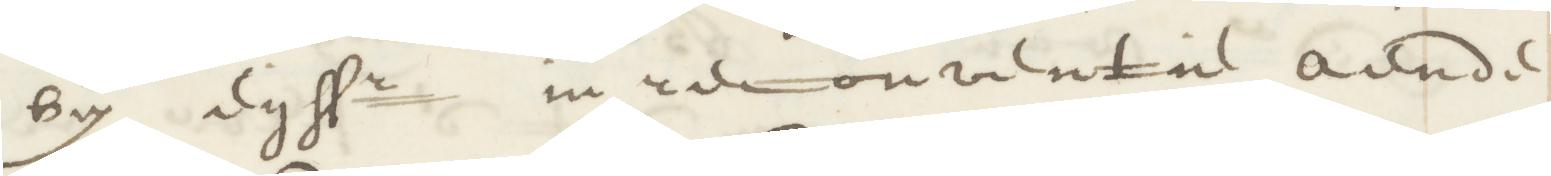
hij eyss=r in reconventie aende
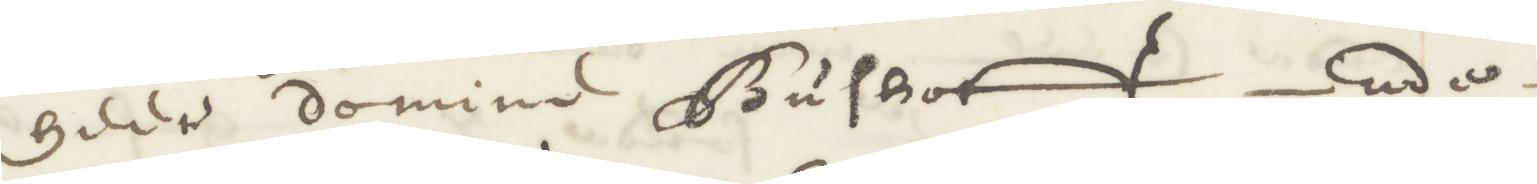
heer domine Bushoff ende
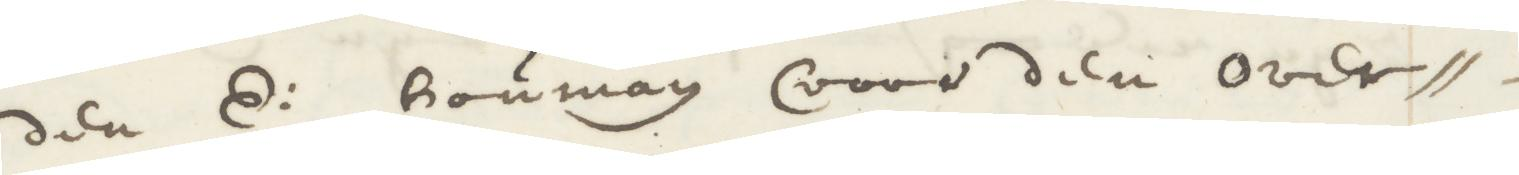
den E: houman voor den over„
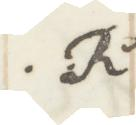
.R
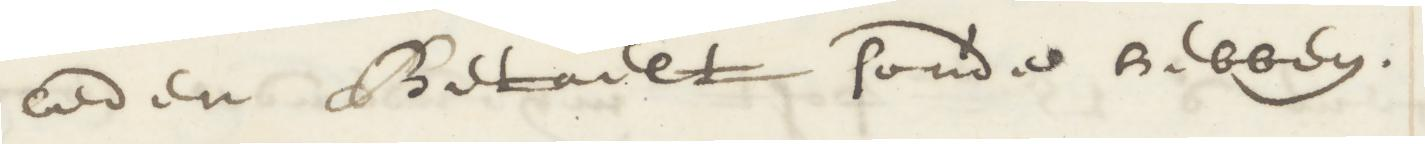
leden Betaelt soude hebben.
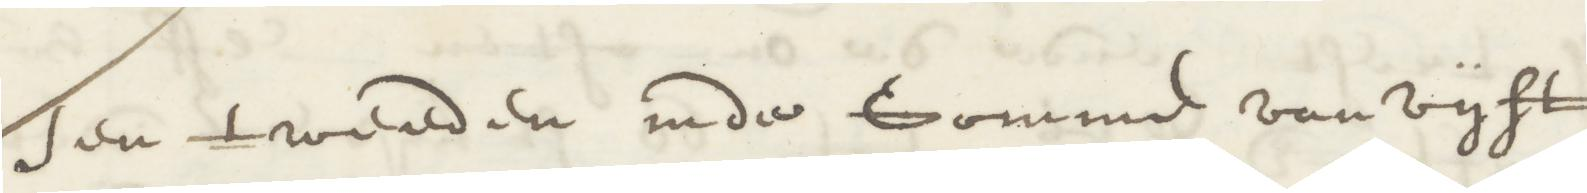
Ten tweeden in de Somme van vijft
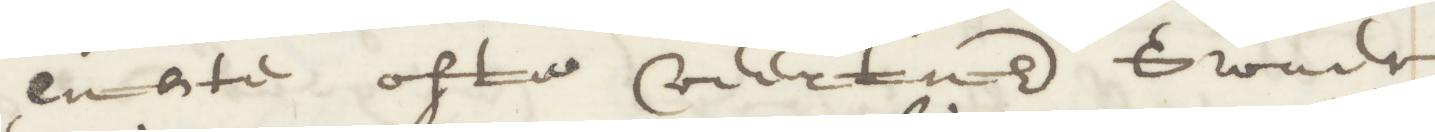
lichte ofte veertich swaer
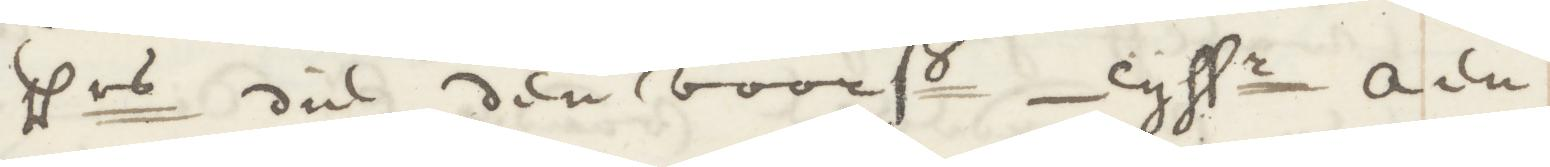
R=rs die den voors=z eijss=r aen
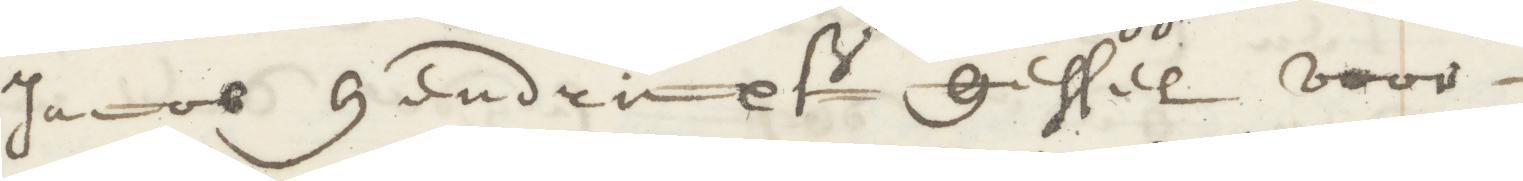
Jacob Hendricx gessel voor-
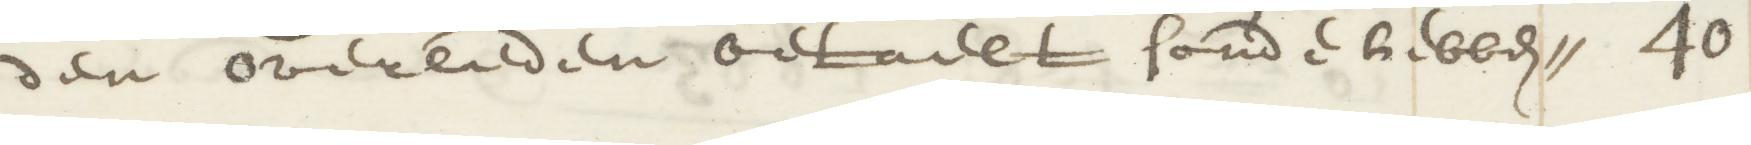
den overleden betaelt soude hebben„ 40
